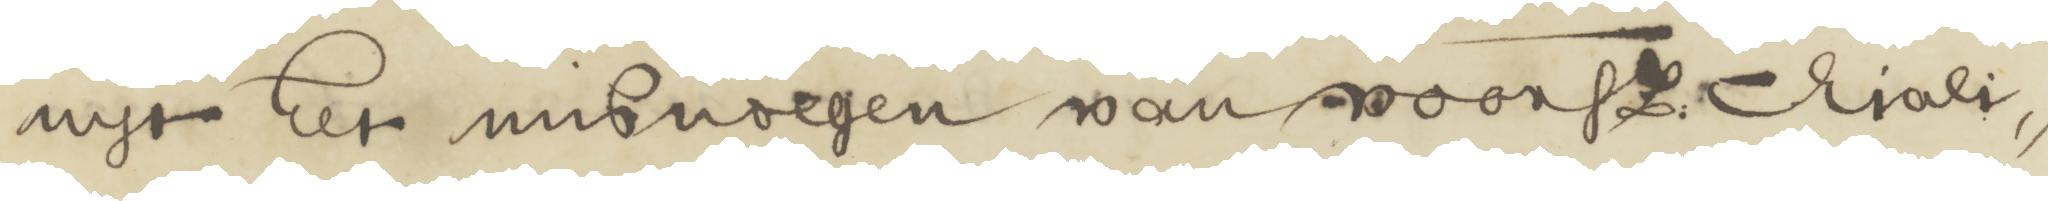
uijt het misnoegen van voorsz: chiali„
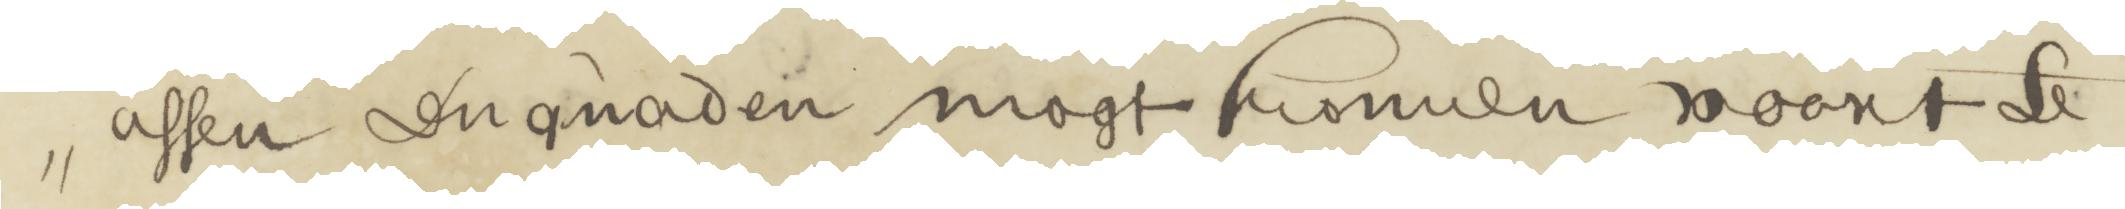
„assen ten quaden mogt komen voort te
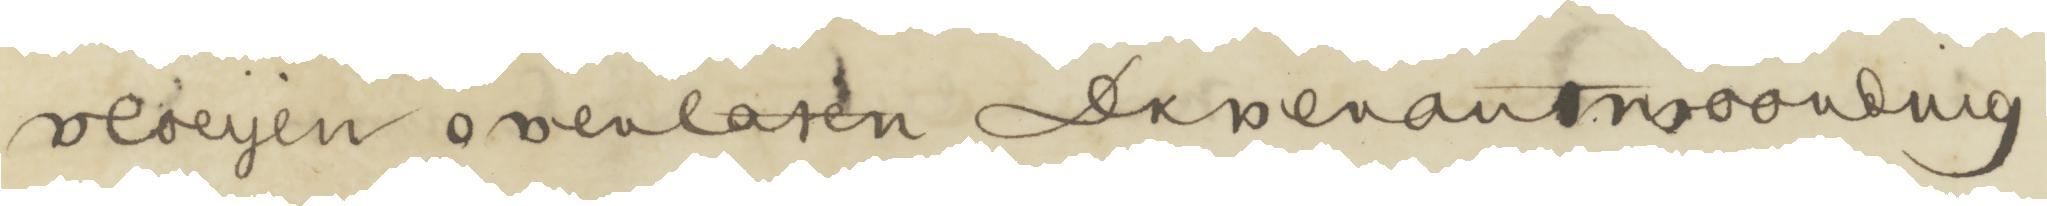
vloeijen overlaten ter verantwoording
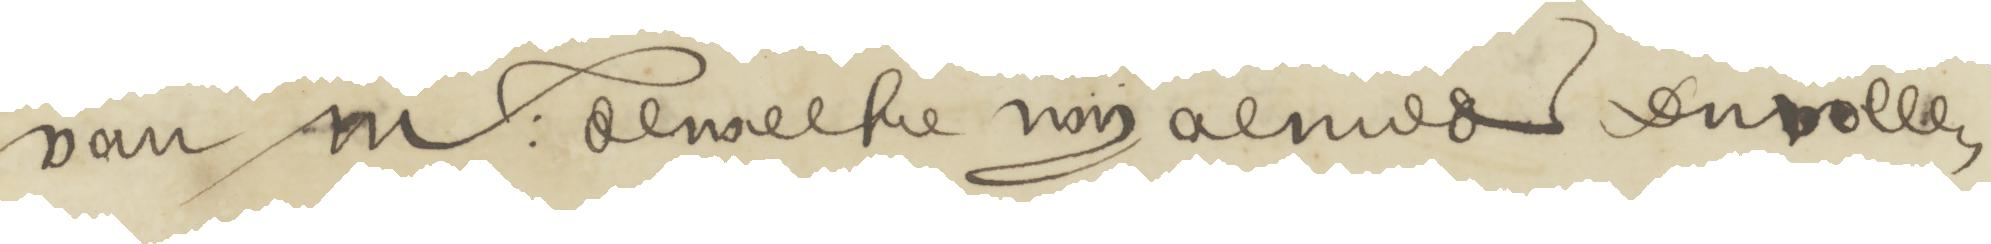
van uE: dewelke wij almede ten vollen
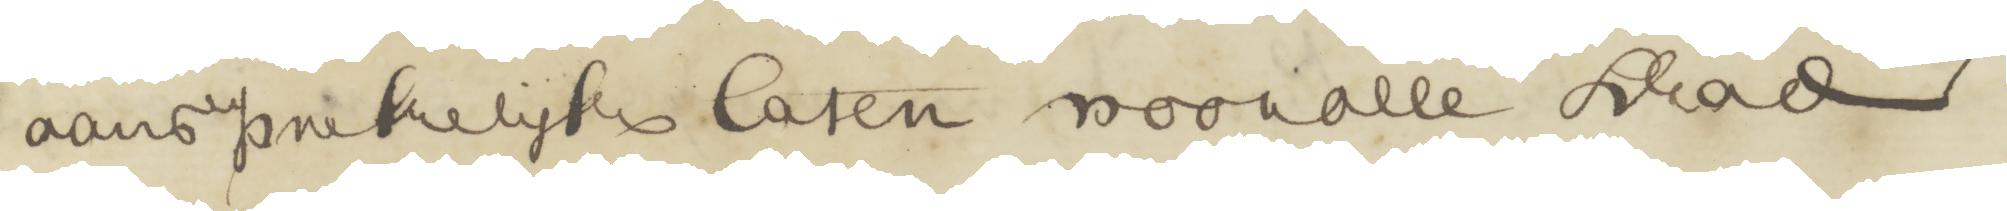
aansprekelijk laten voor alle schade
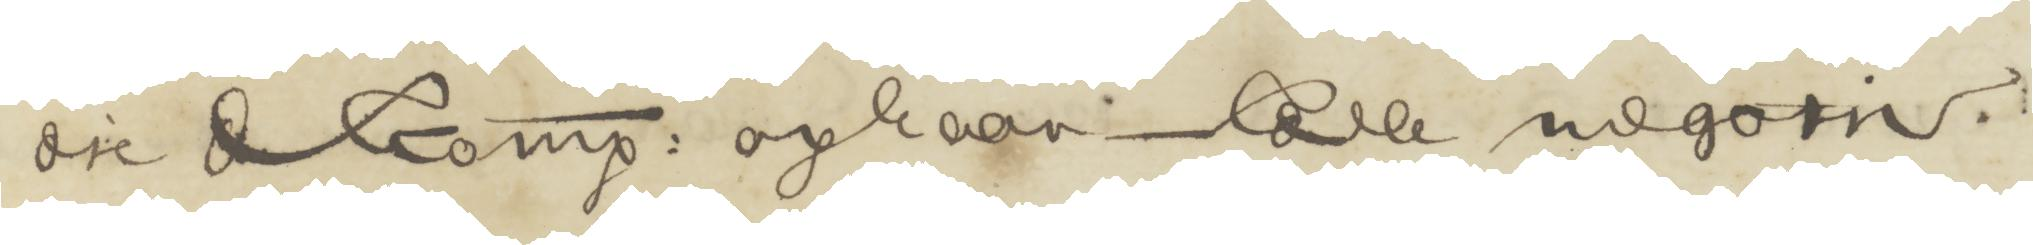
die dEComp: op haar Edele negotie.
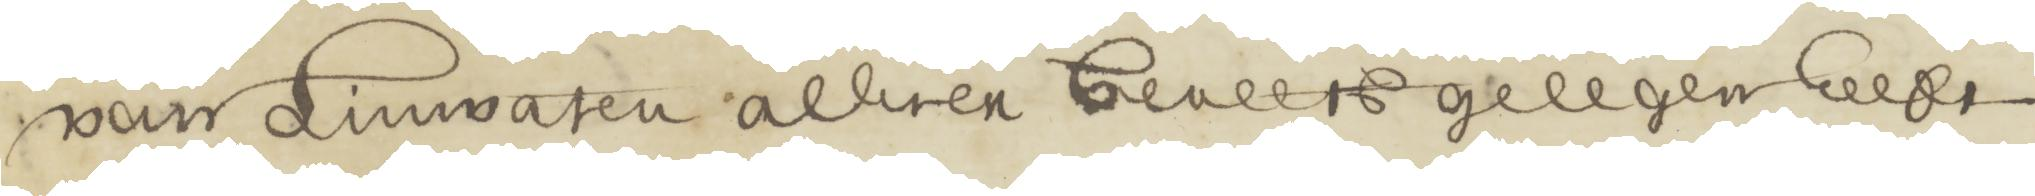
van Linwaten alhier bereets gelegen heeft
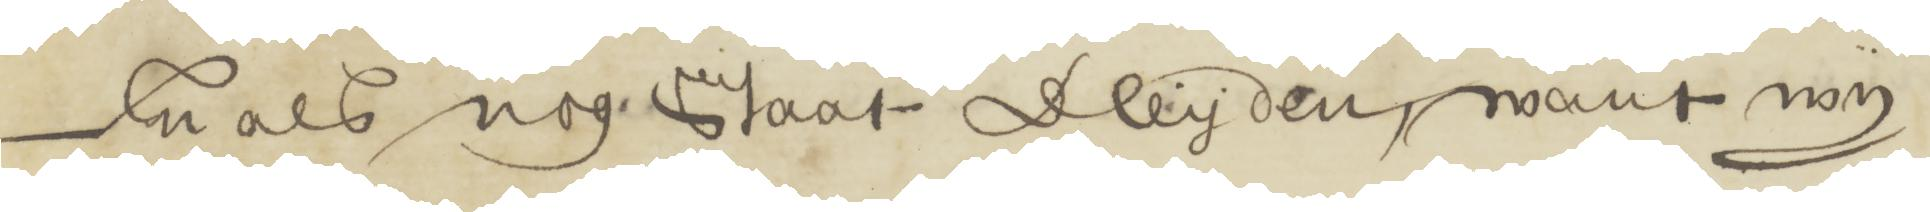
En als nog staat te leijden, want wij
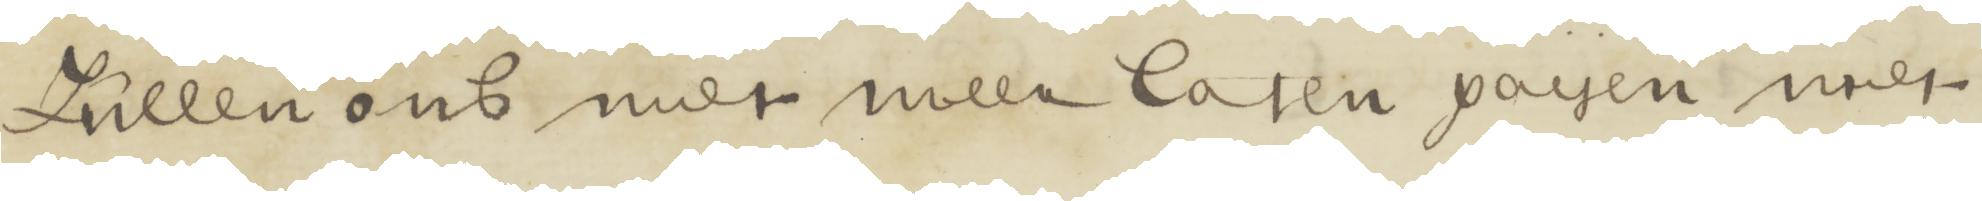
zullen ons niet meer laten paijen met
